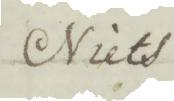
Niets
